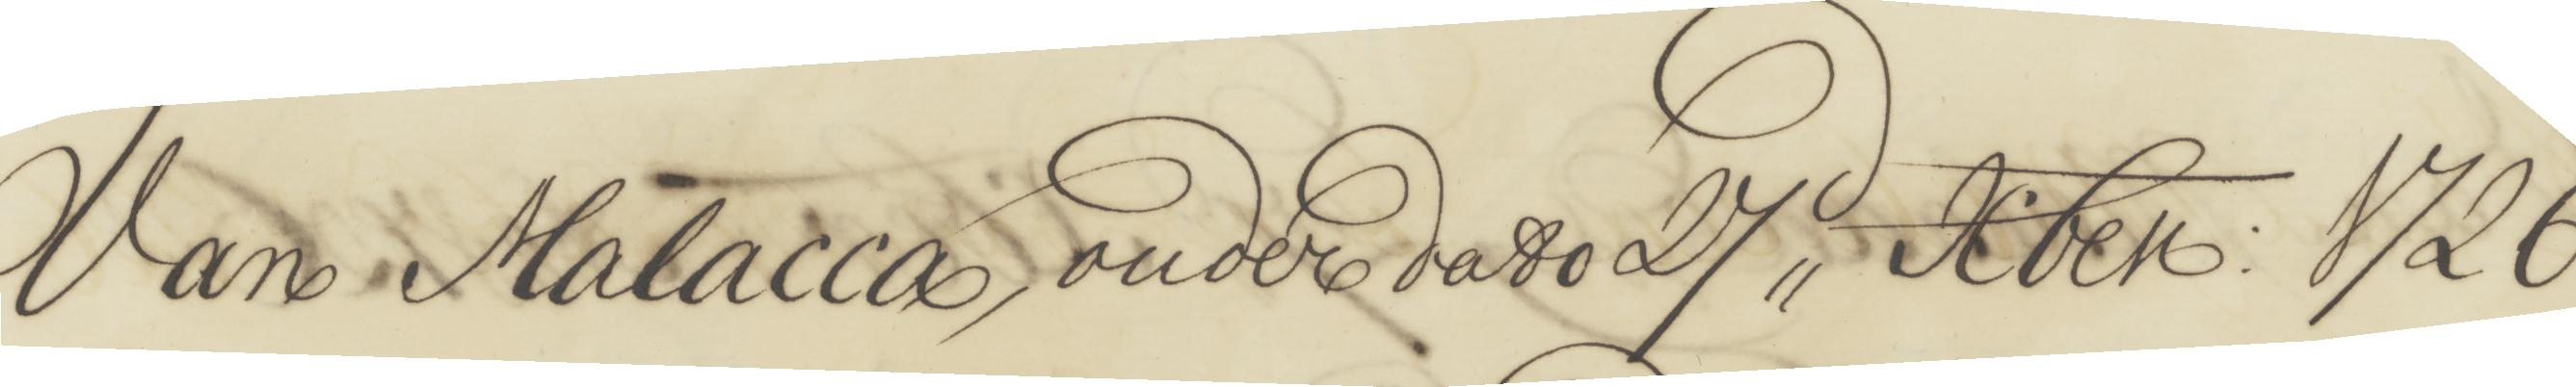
Van Malacca, onder dato 27„' xber: 1726
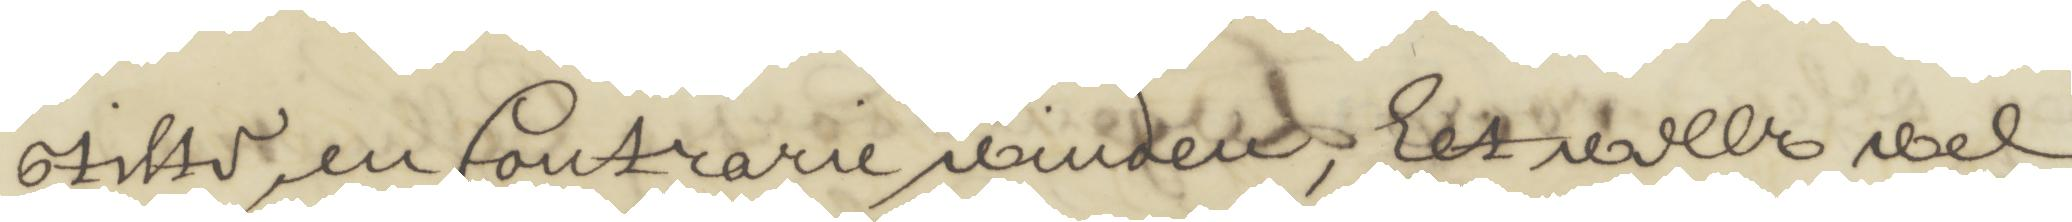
stilte, en contrarie winden, het welk wel
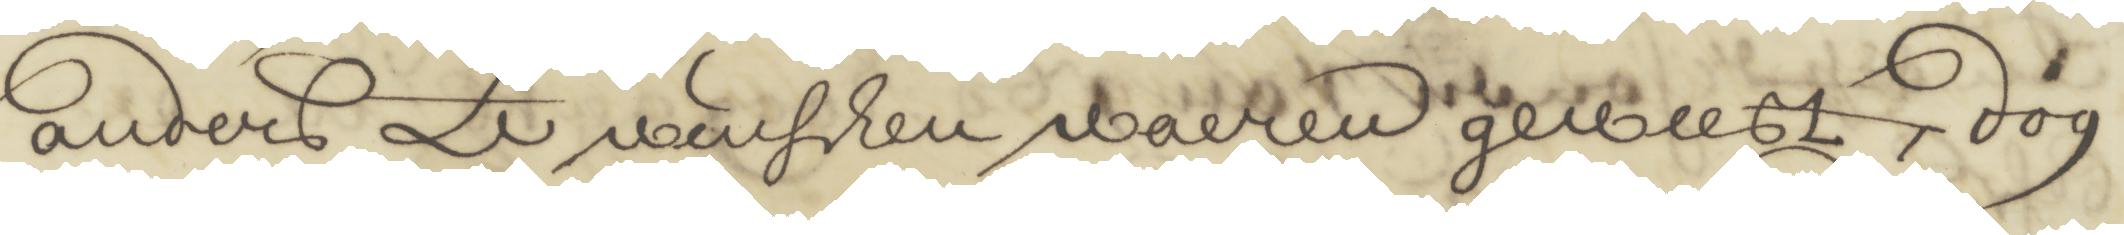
anders te wenschen waeren geweest, dog
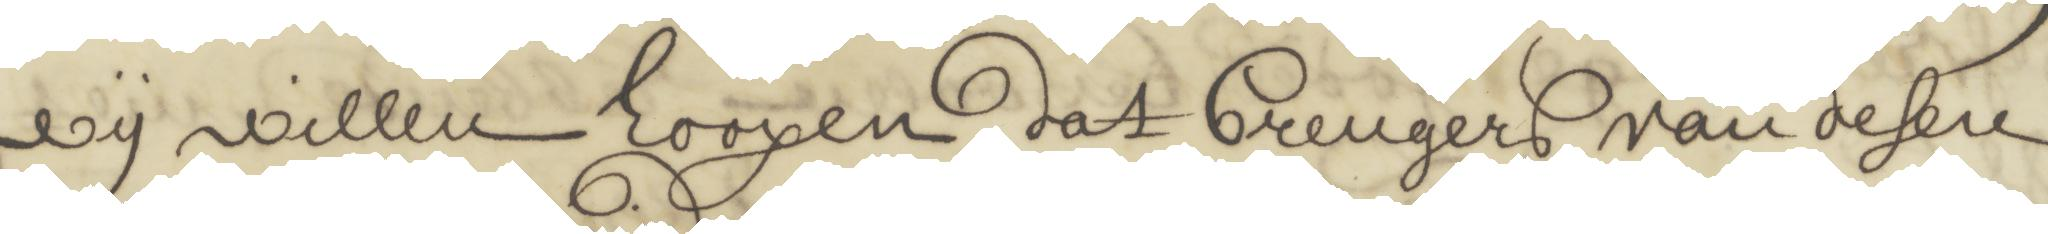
wij willen hoopen, dat brengers van desen
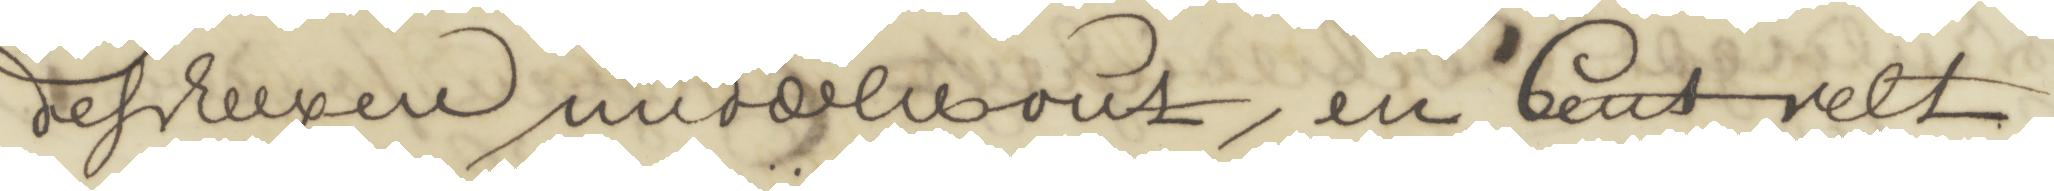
descheepen middelwout, en bentvelt,
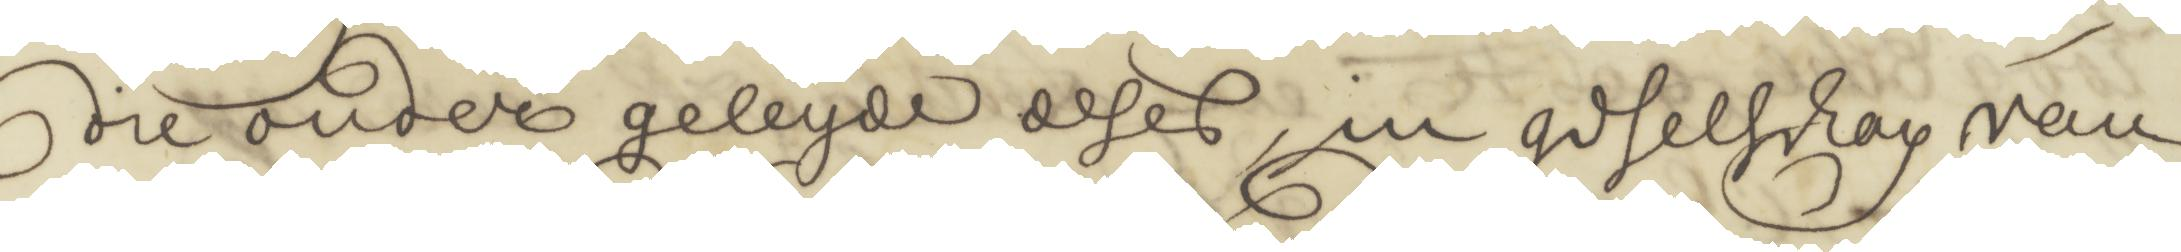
die onder geleijde deses, in geselschap van
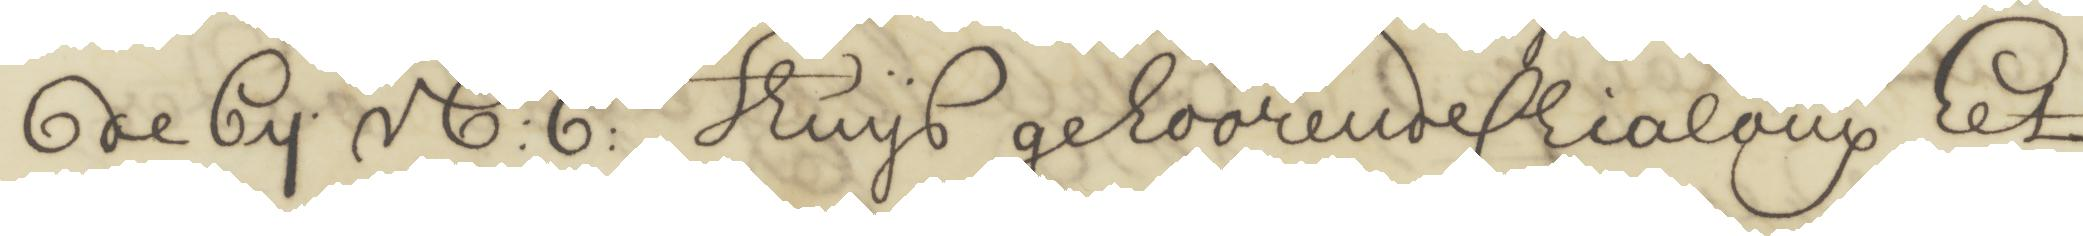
de by VE: E:s thuijs gehoorende Chialoup het
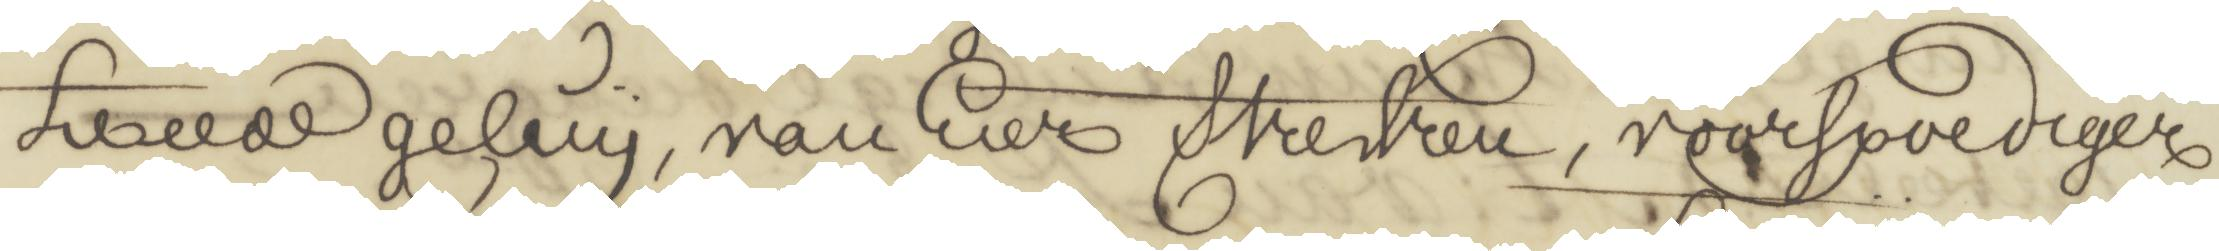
tweede geluij, van hier vertrecken, voorspoediger
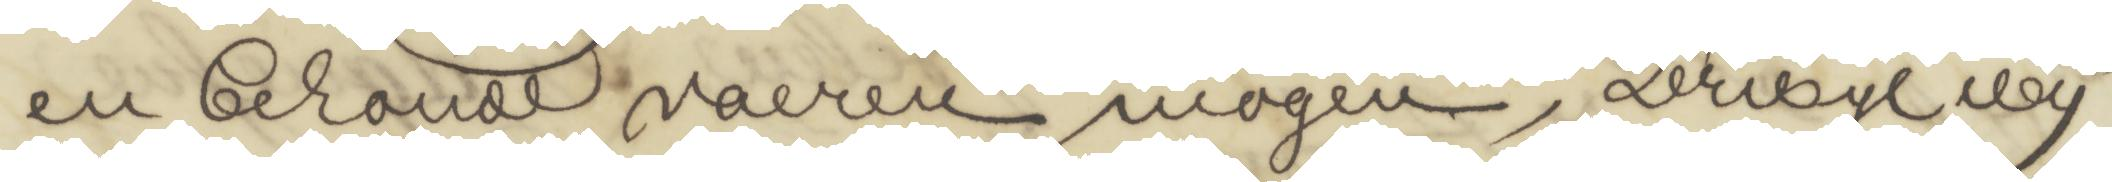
en behoude vaeren mogen, terwijl wij
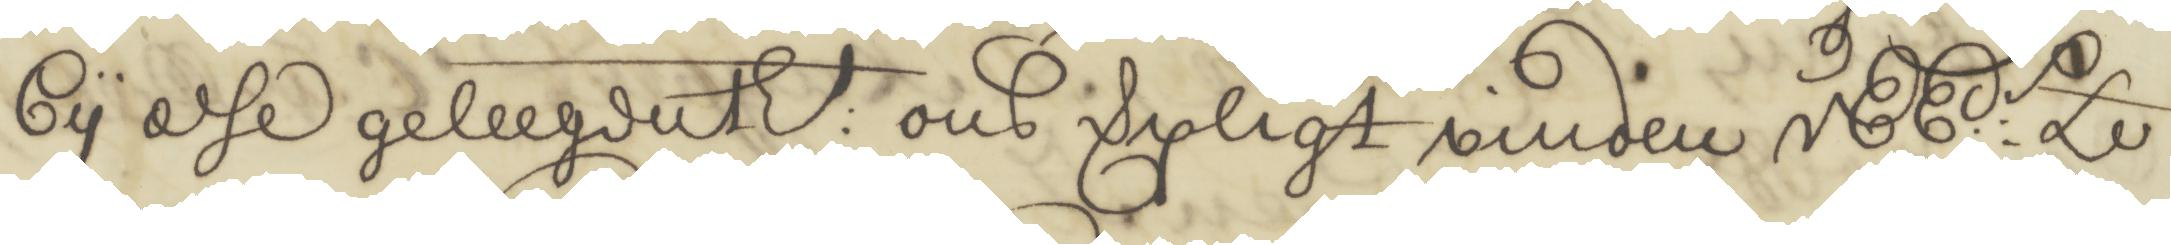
bij dese geleegenth:t ons verpligt vinden VEE::s te
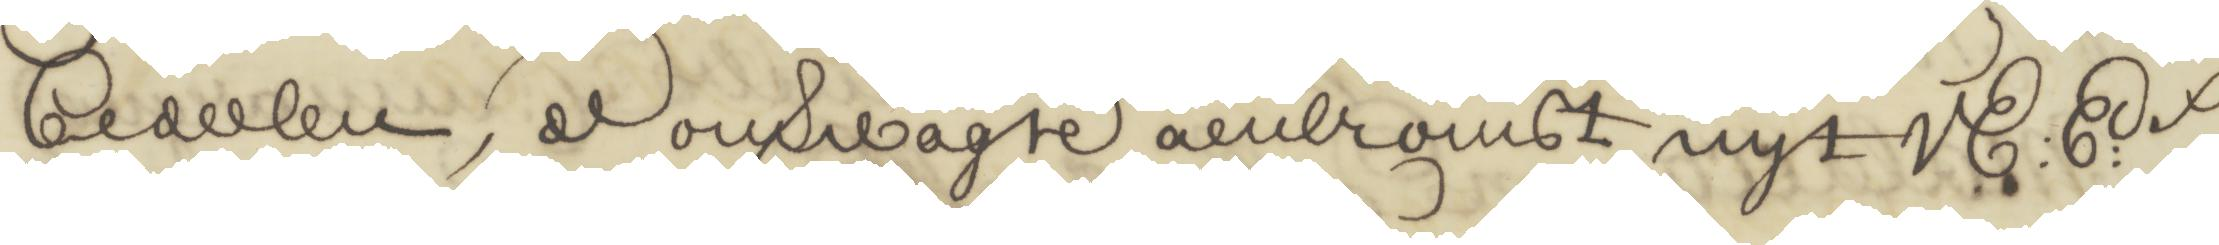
bedeelen, de onverwagte aenkomst uijt VE: E:s
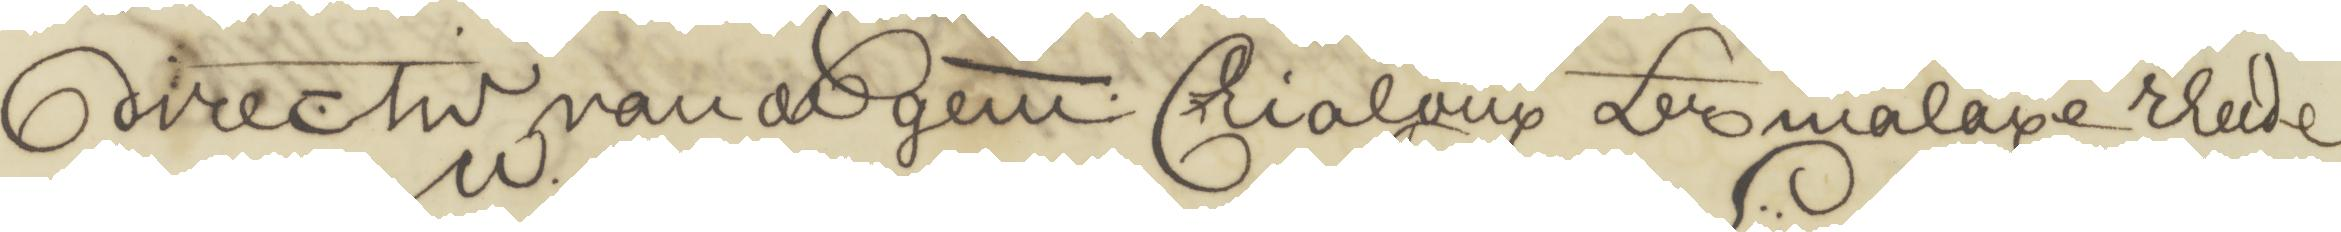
directie van de gem: Chialoup ter malaxe rheede
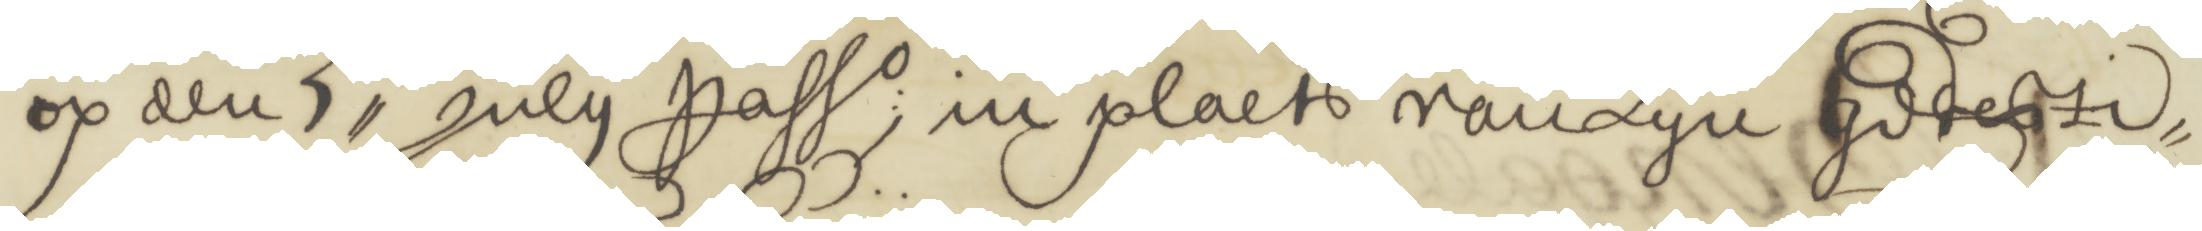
op den 5„n julij pass„o, in plaets van Lijn gedesti„
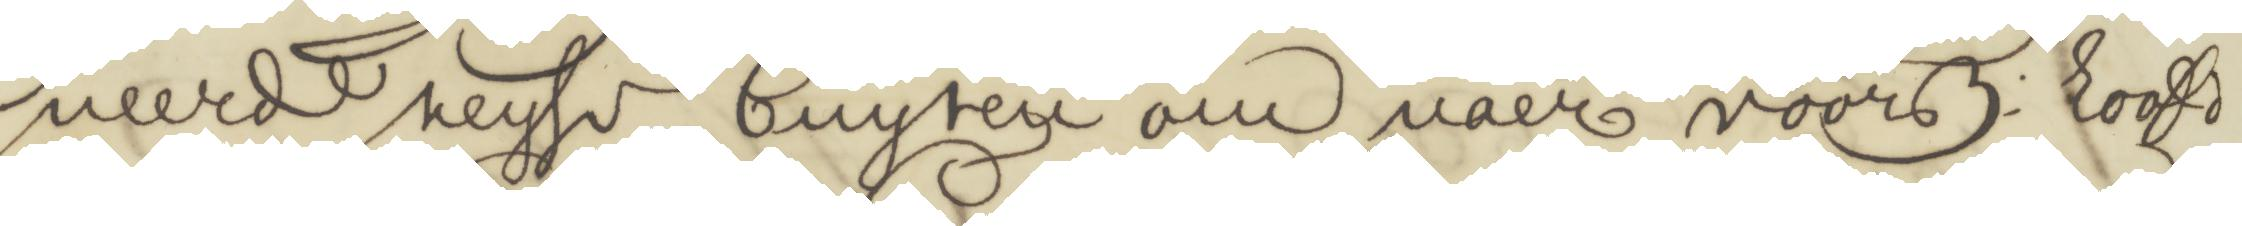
neerde reyse, buijten om naer voorsz: hoofd
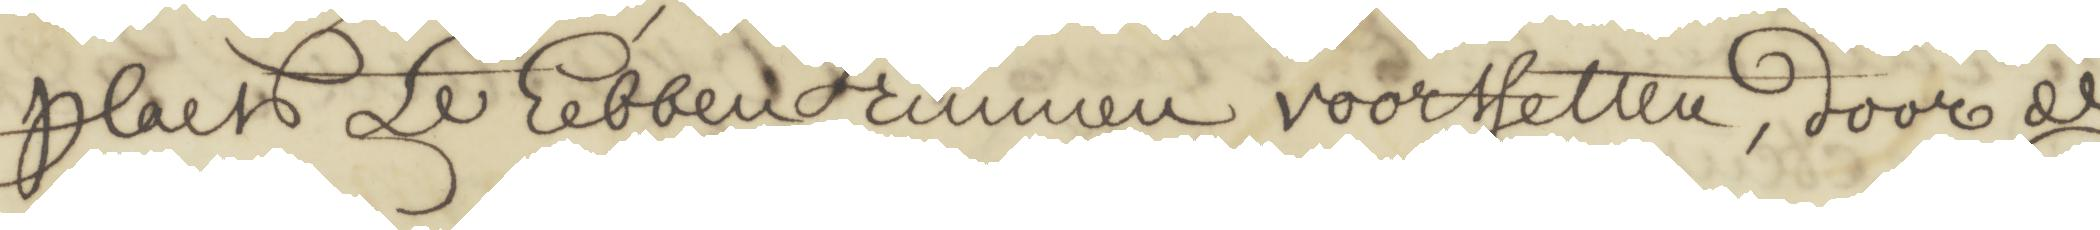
plaets te hebben kunnen voortsetten, door de
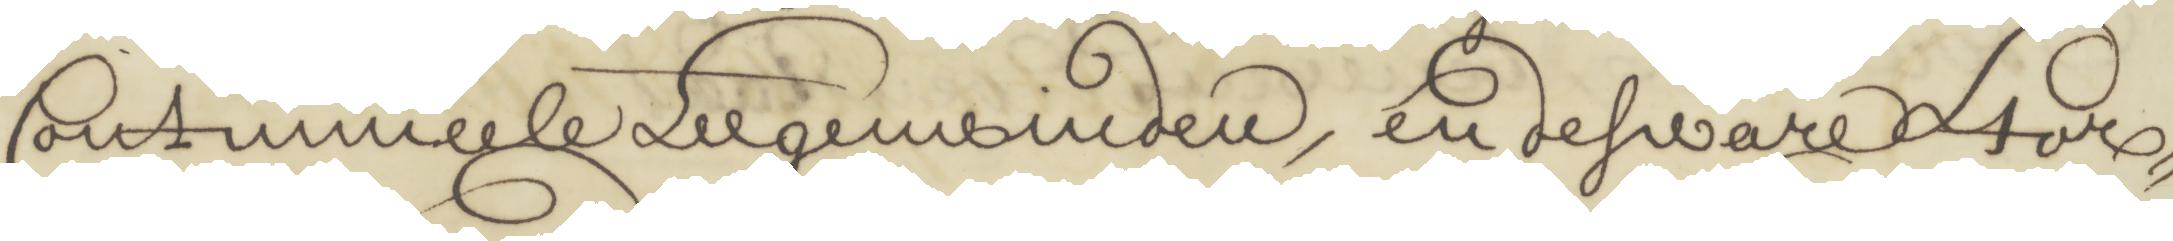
continueele teegenwinden, en desware Stor„
